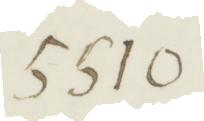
5510
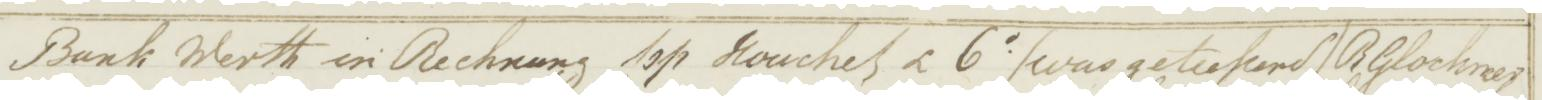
Bank Werth in Rechnung top Houchet & C.o (was geteekend) R Glocknes
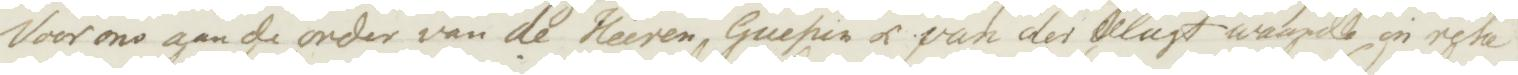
Voor ons aan de order van de Heeren Guepin & van der Vlugt waarde in reke
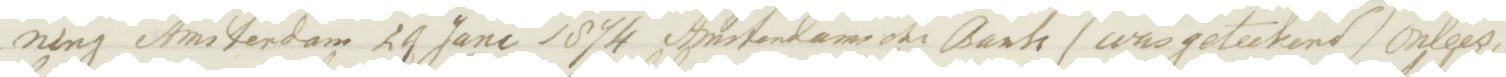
ning Amsterdam 29 Juni 1874 Amsterdamsen Bank (was geteekend) Onlees
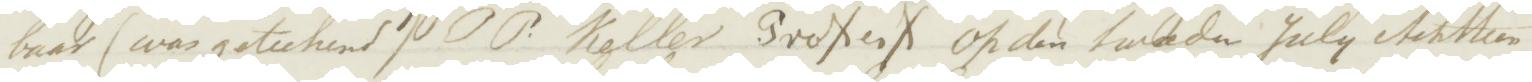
baar (was geteekend) I P. Keller Protest op den tweeden July Achttien
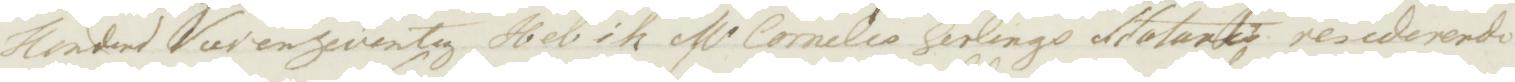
Honderd Vierenzeventig Heb ik Mr Cornelis Gerlings Notaris residerende
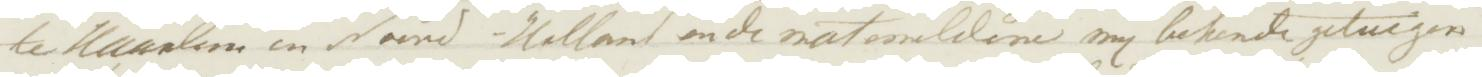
te Haarlem in Noord-Holland en de natemeldene my bekende getuigen
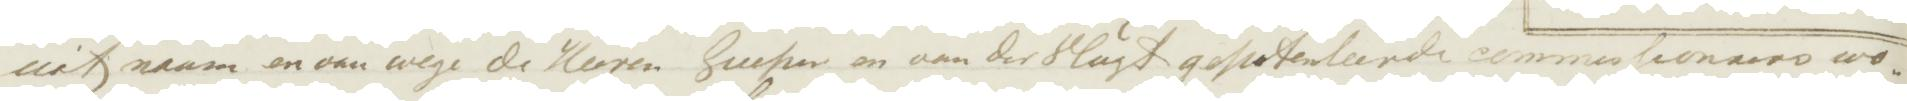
uit naam en van wege de Heeren Guepin en van der Vlugt gepatenteerde commissionairs wo„
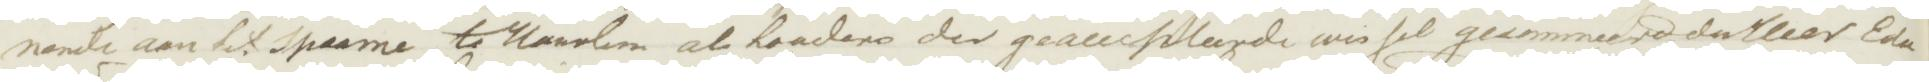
nende aan het spaarne te Haarlem als houders der geaccepteerde wissel gesommeerd den Heer Edu
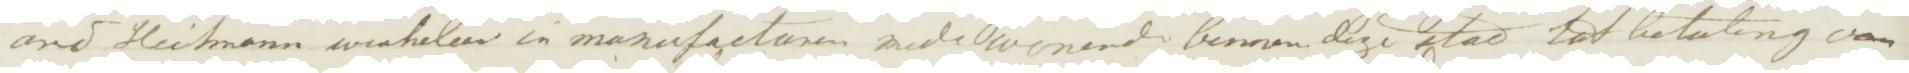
ard Heitmann winkelier in manufacturen mede wonende binnen deze stad tot betaling van
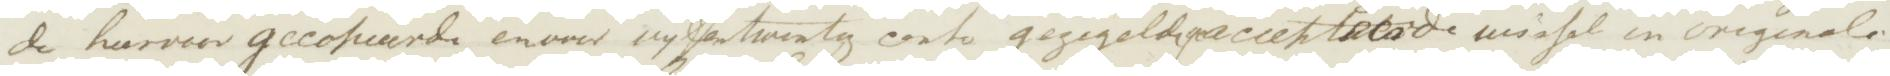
de hiervoor gecopieerde en voor vyfentwintig cents gezegelde geaccepteerde wisssel in originali
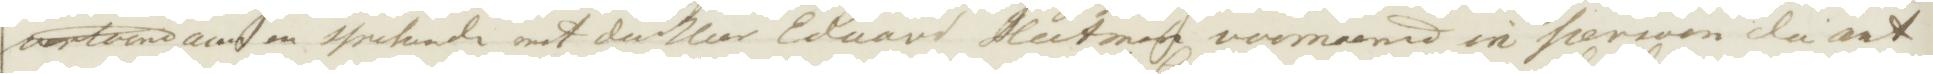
vertoond aan en sprekende met den Heer Eduard Heitman voornoemd in persoon die ant
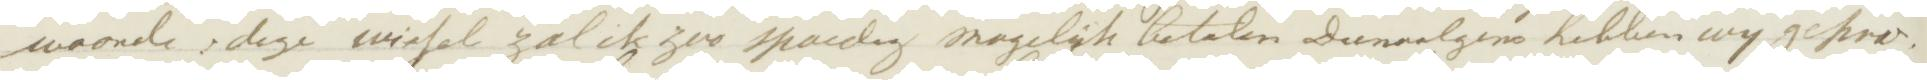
woorde: deze wissel zal ik zoo spoedig mogelijk betalen Dienvolgens hebben wy gepro„
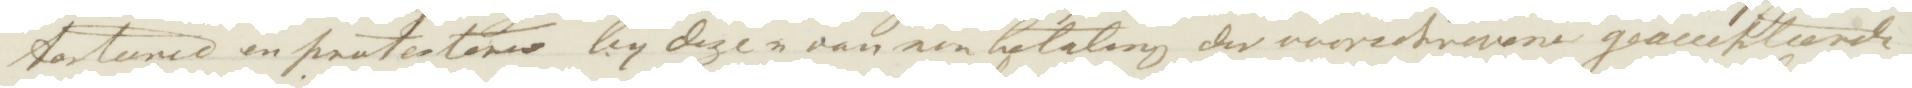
testeered en protesteren by dezen van non betaling der voorschrevene geaccepteerde
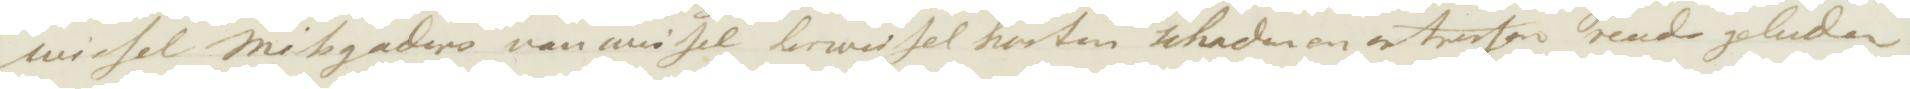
wissel mitsgaders van wissel herwissel kosten schaden en intressen reeds geleeden
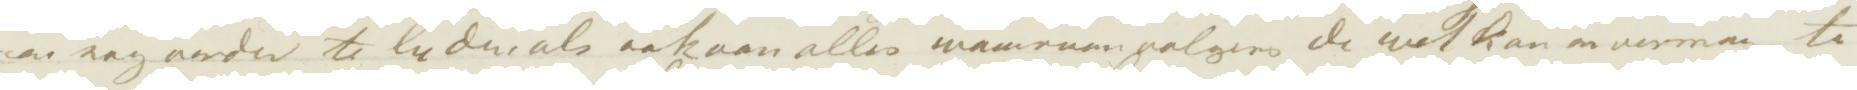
en nog onder te lyden als ook aan alles waarvan volgens de wet kan en vermag te
